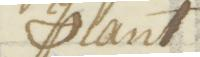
plant
